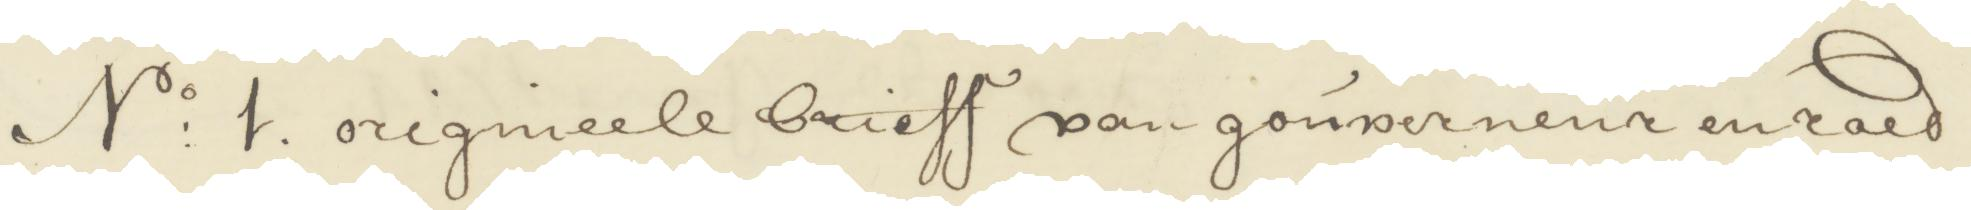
N:o 1. origineele brieff van gouverneur en raed
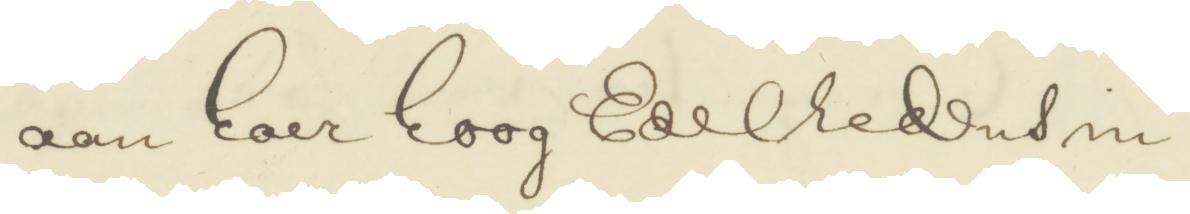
aan haer hoog Edelhedens in
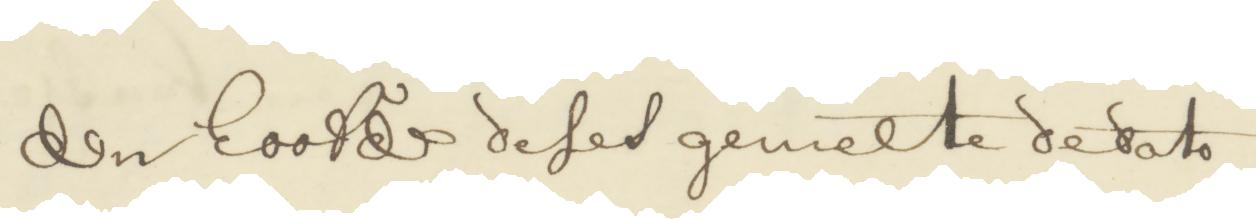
den hoofde deses gemelte de dato
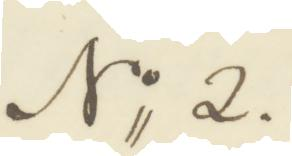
N„o 2.
